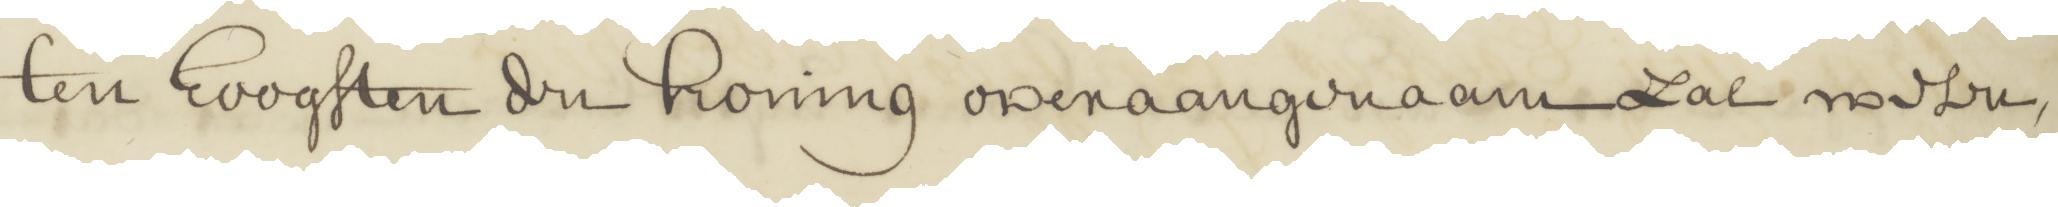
ten hoogsten den koning overaangenaam Zal wesen,
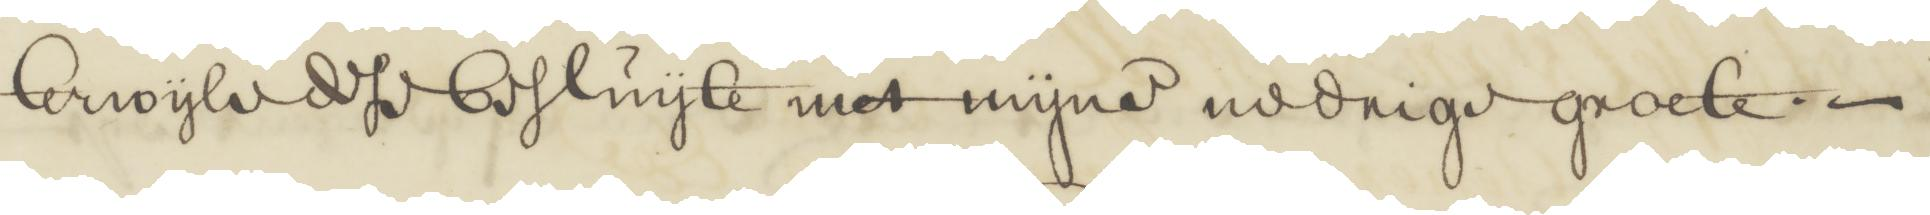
terwijle dese besluijte met mijne nedrige groete.—
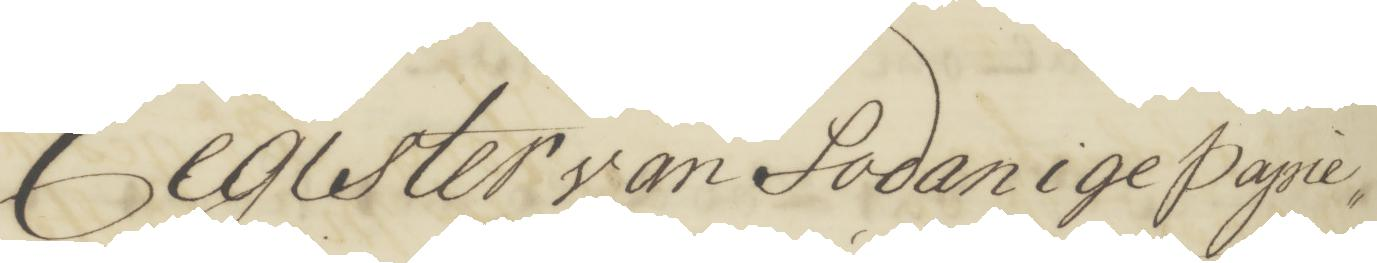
Register van Sodanige Papie„
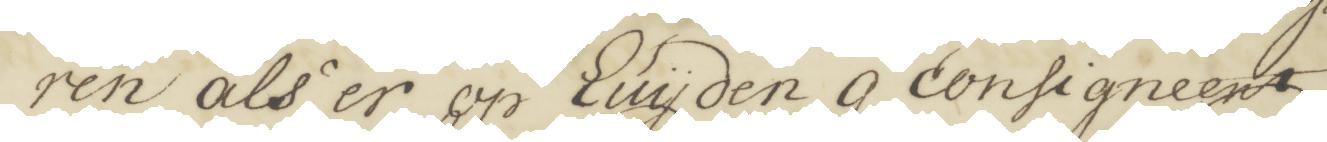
ren, als er op huijden g'consigneert
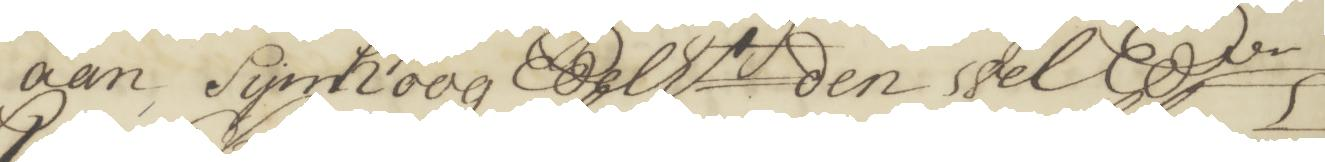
aan, sijn hoog Edelh=t den wel Ed=en
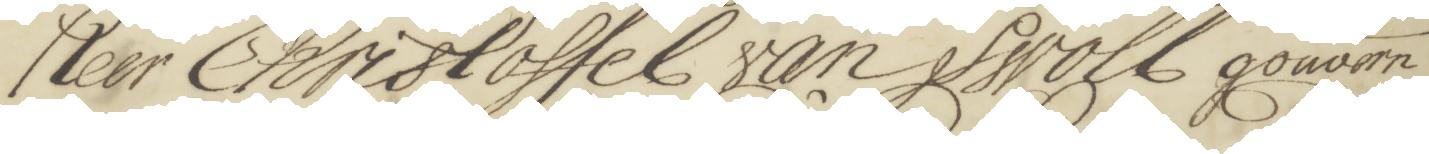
Heer Christoffel van Swoll gouvern
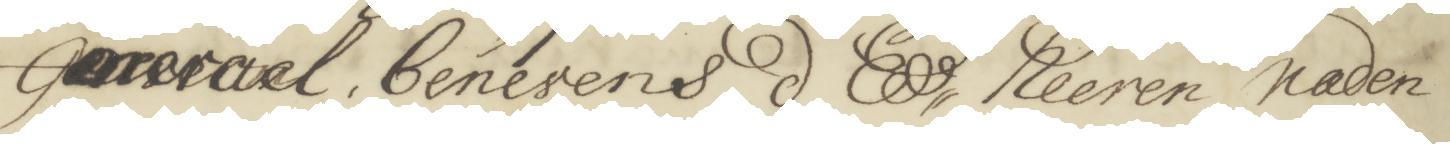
generael, benevens d’ Ed„e Heeren raden
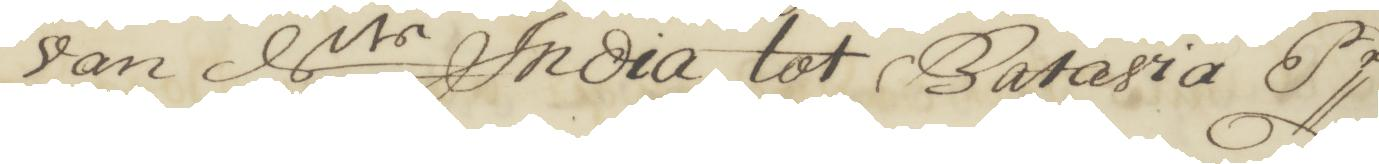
van N=ts India tot Batavia P„r
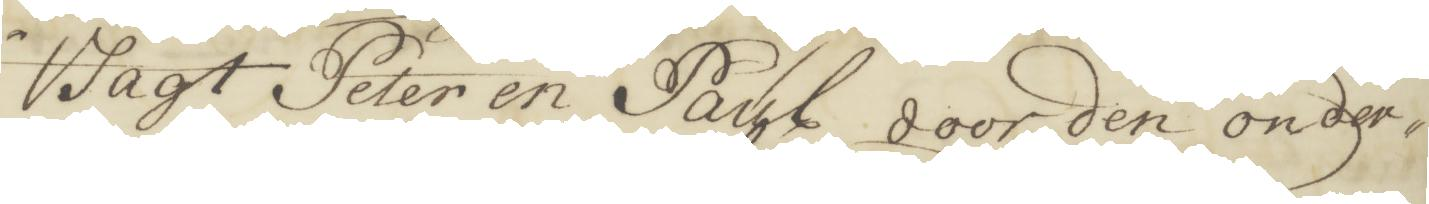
Iagt Peter en Paul door den onder„
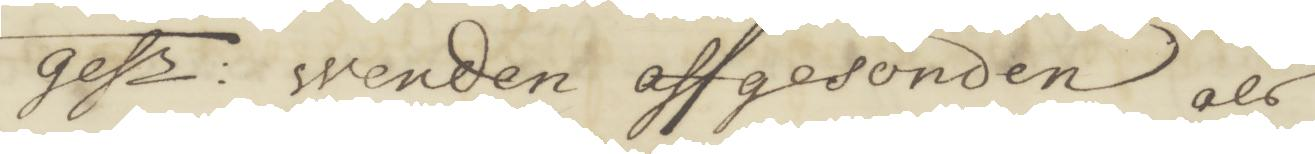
gesz: werden affgesonden als
